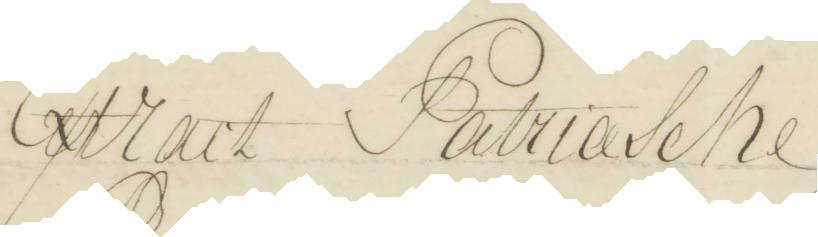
Extract Patriasche
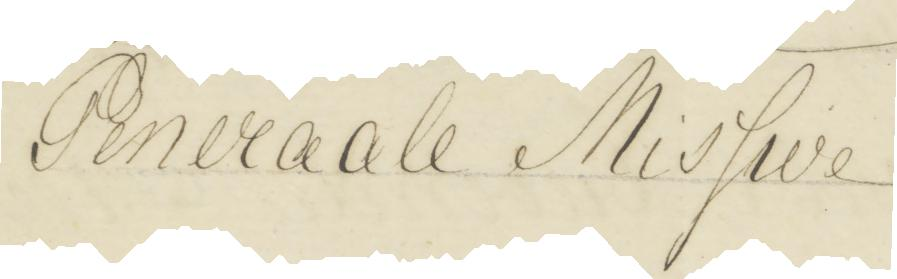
Generaale Missive
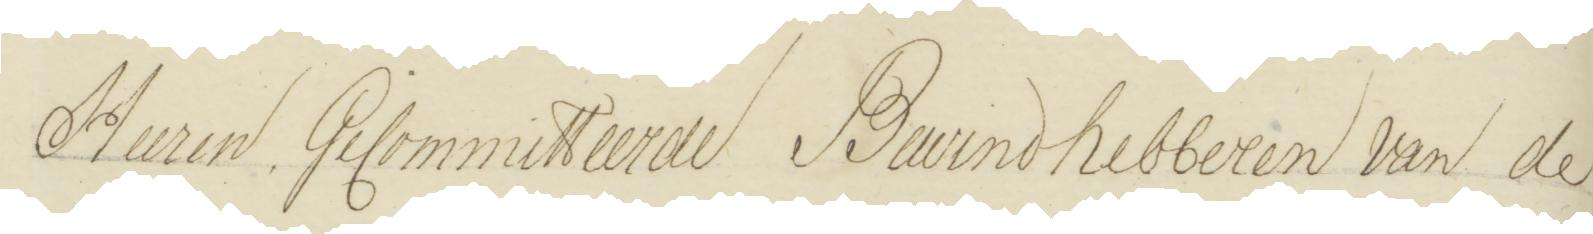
Heeren Gecommitteerde Bewind hebberen van de
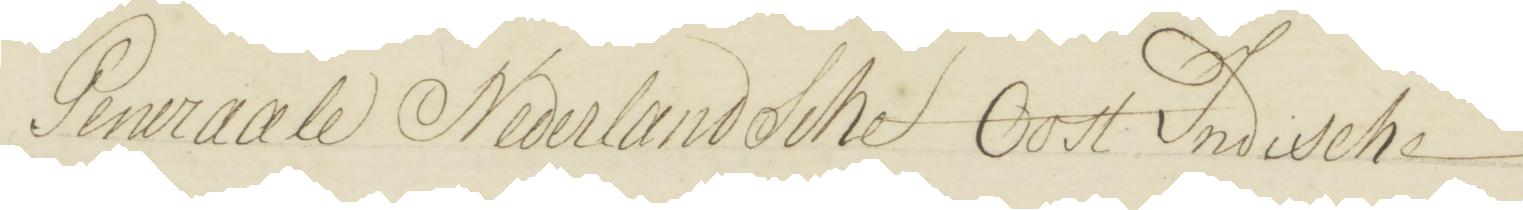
Generaale Nederlandsche Oost Indische
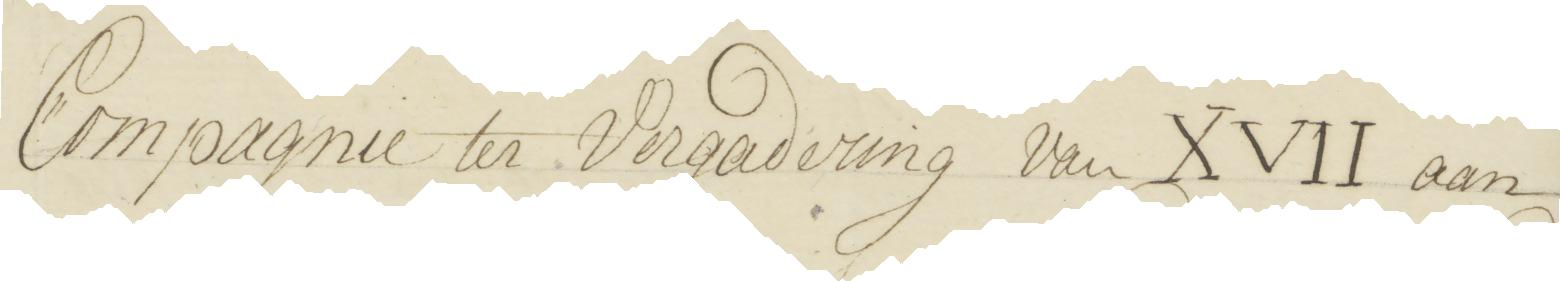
Compagnie ter Vergadering van XVII aan
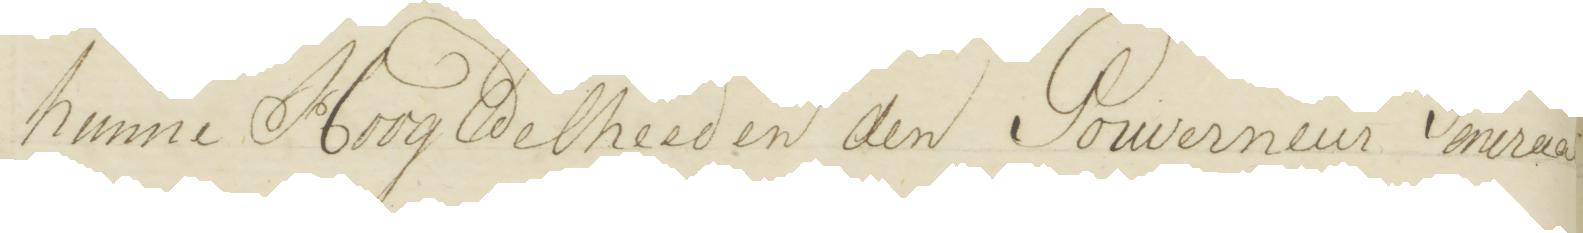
hunne Hoog Edelheeden den Gouverneur Generaa
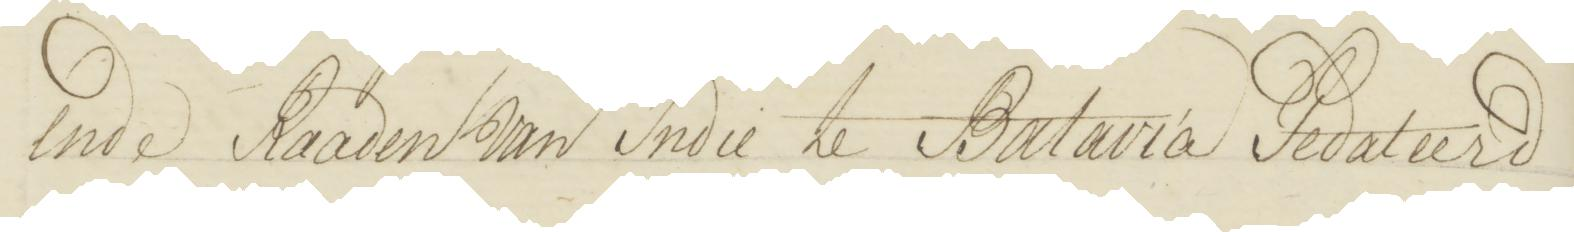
lnde Raaden van Indie te Batavia Gedateerd
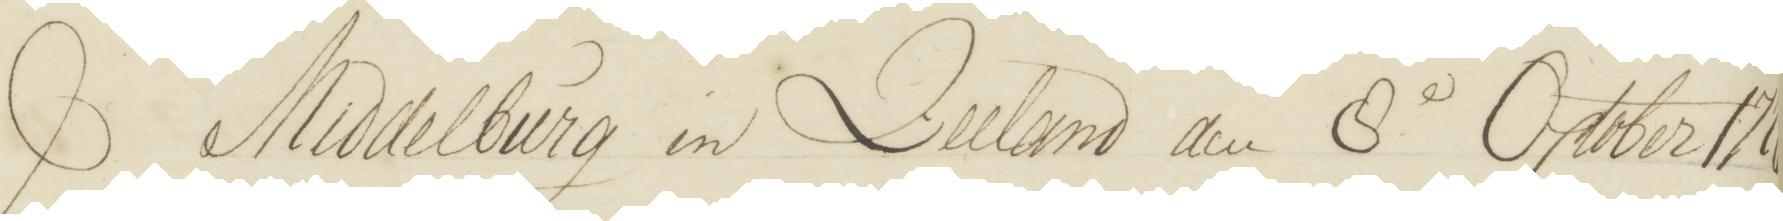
Middelburg in Zeeland den 8:e October 174
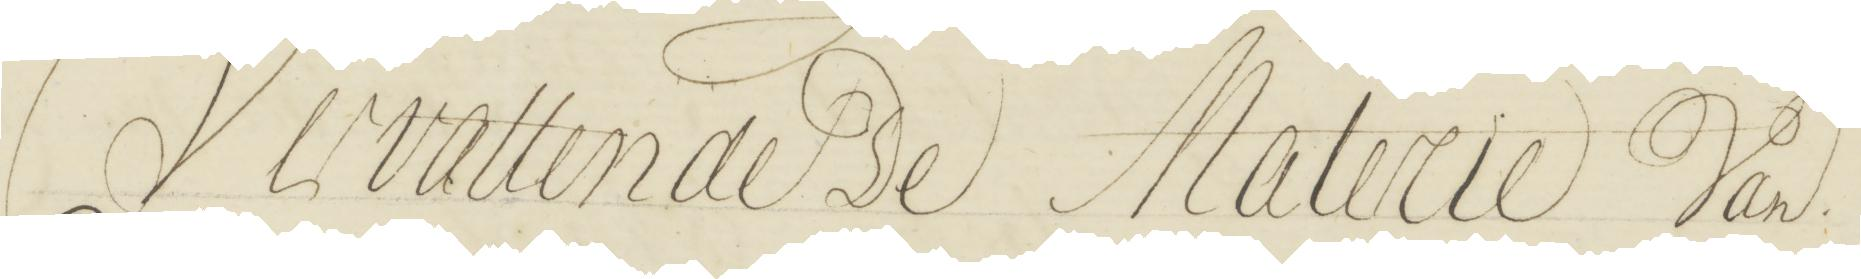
Vervattende De Materie Van
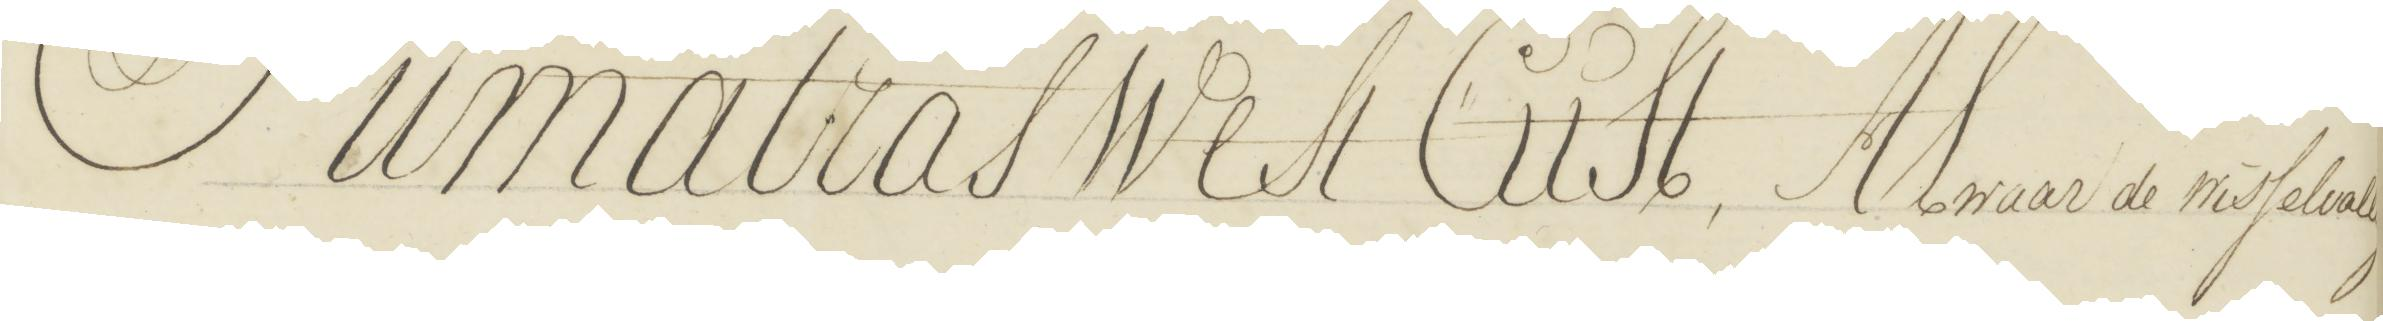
Sumatras West Cust, Alwaar de wisselval
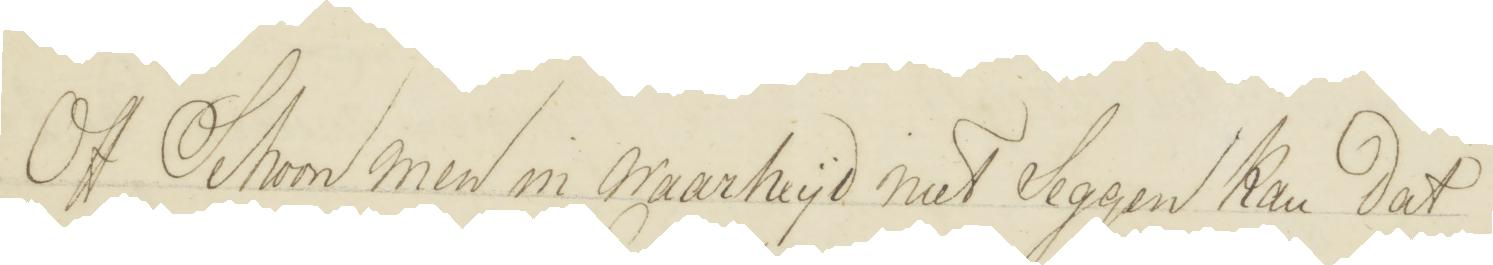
Off Schoon men in waarheijd niet seggen kan dat
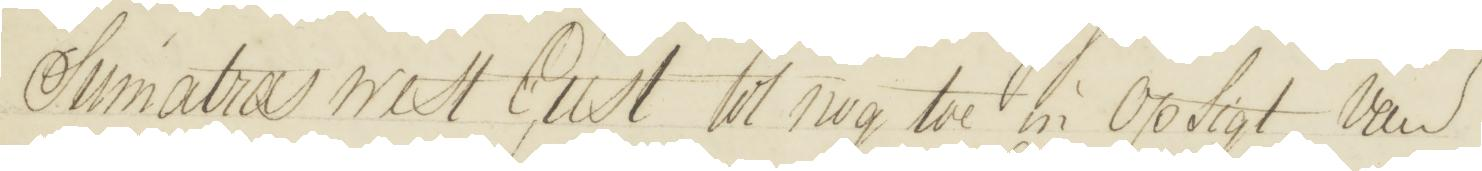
Sumatras West Cust tot nog toe in Opsigt van
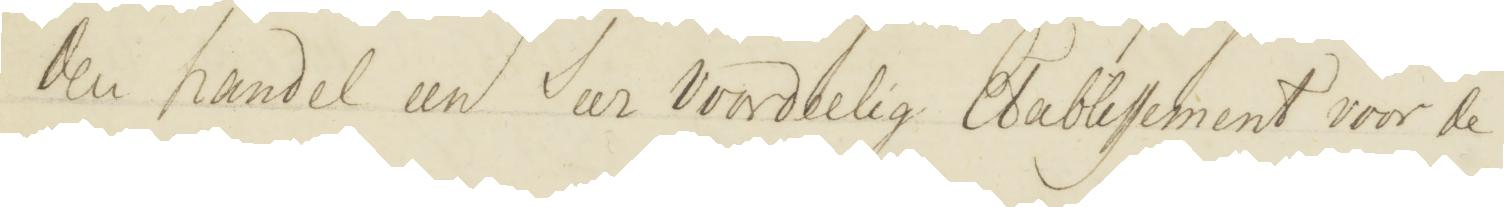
den handel een seer voordeelig Etablissement voor de
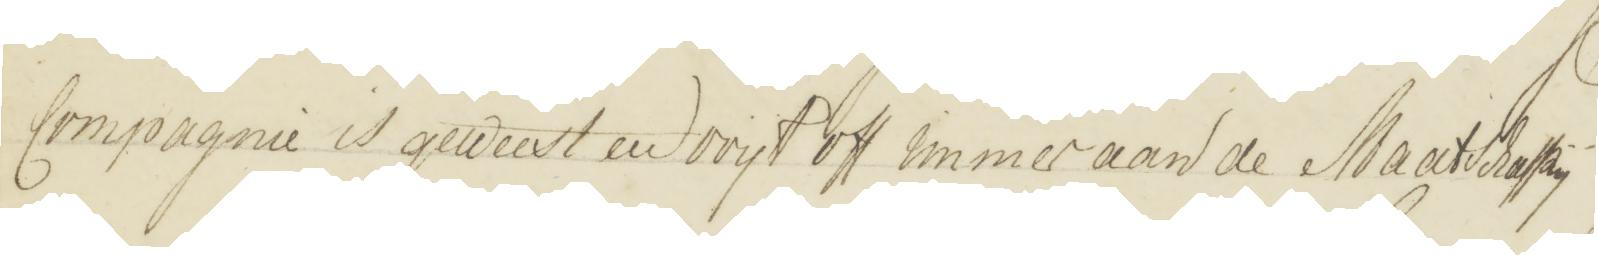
Compagnie is geweest en ooijt off immer aan de Maatschappij
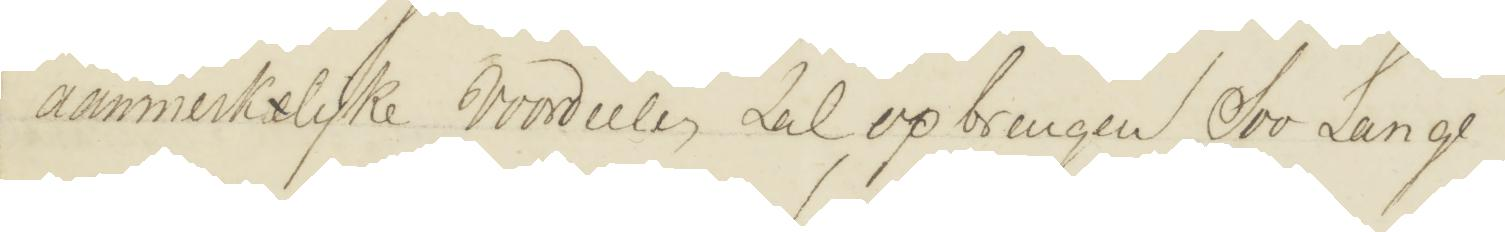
aanmerkelijke voordeelen zal op brengen soo Lange
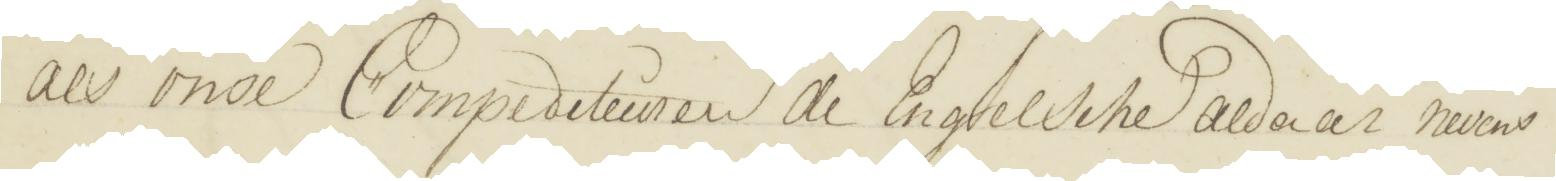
als onse Compediteuren de Engelsche aldaar nevens
